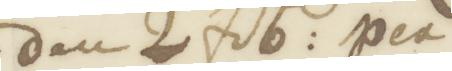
den 2 feb:ij per
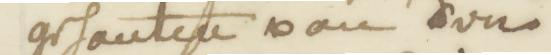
gesonten van den
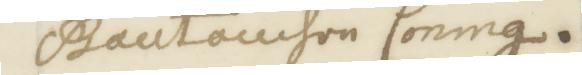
Bantamsen Coning.
